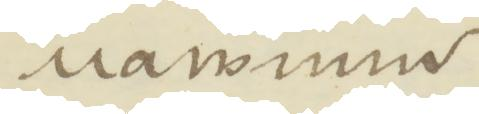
nawinne
